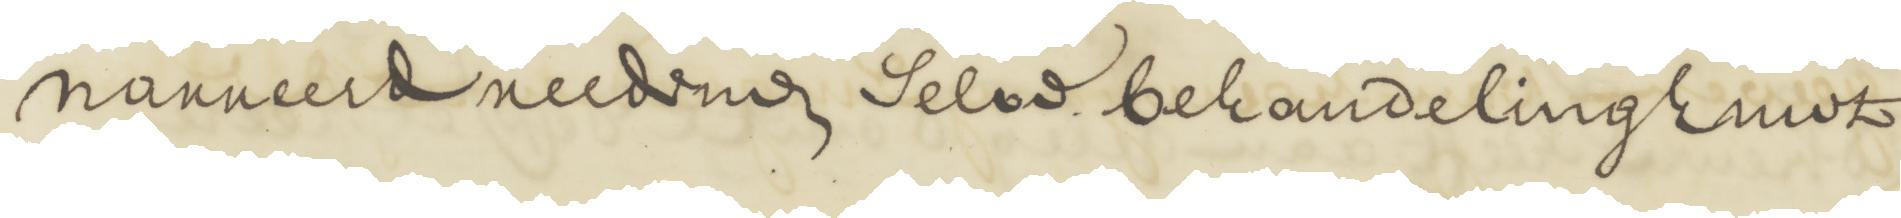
narreerd reedenen selve behandelingh niet
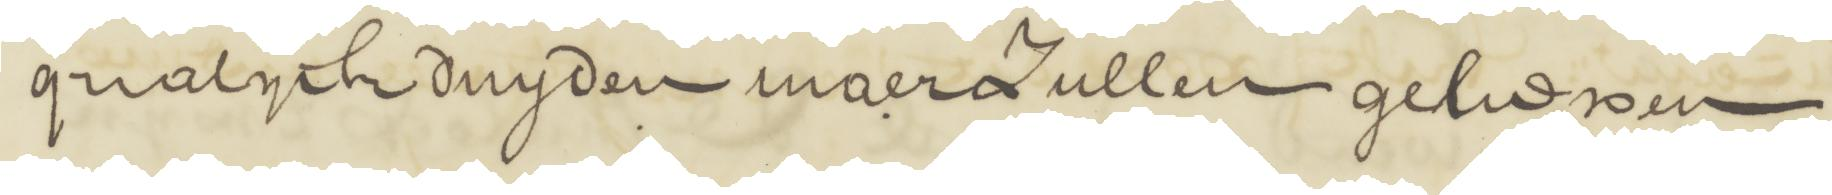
qualyck duyden maer zullen gelieven
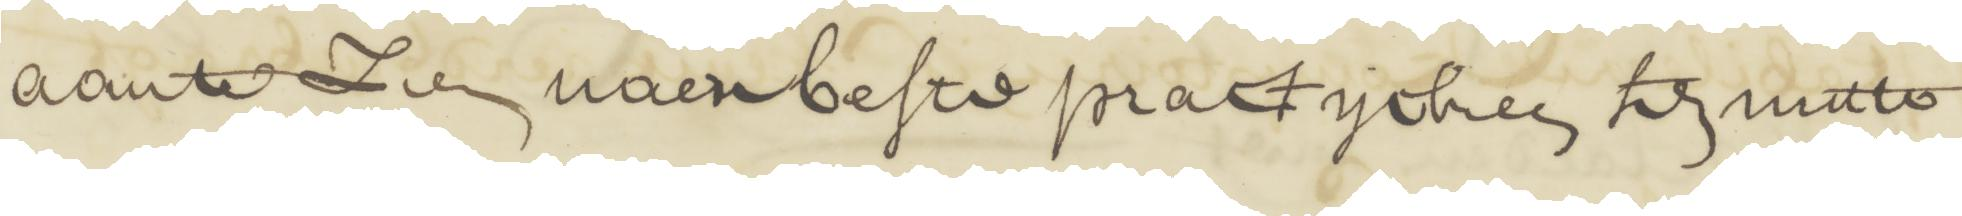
aante zien naer beste practycken ten mitte
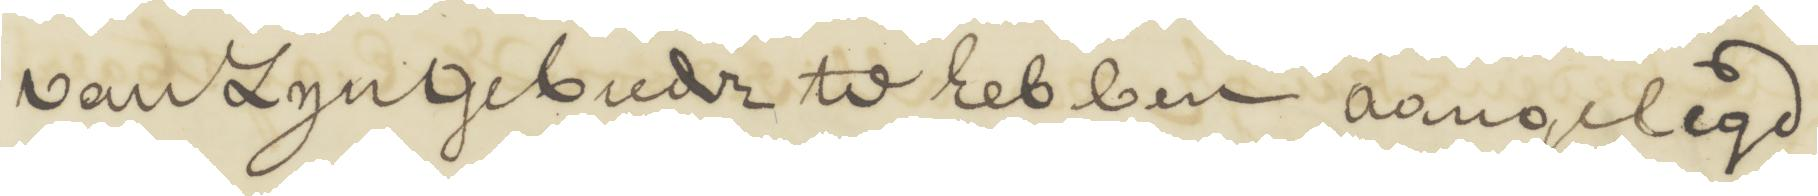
van zyn gebieder te hebben aangelegd
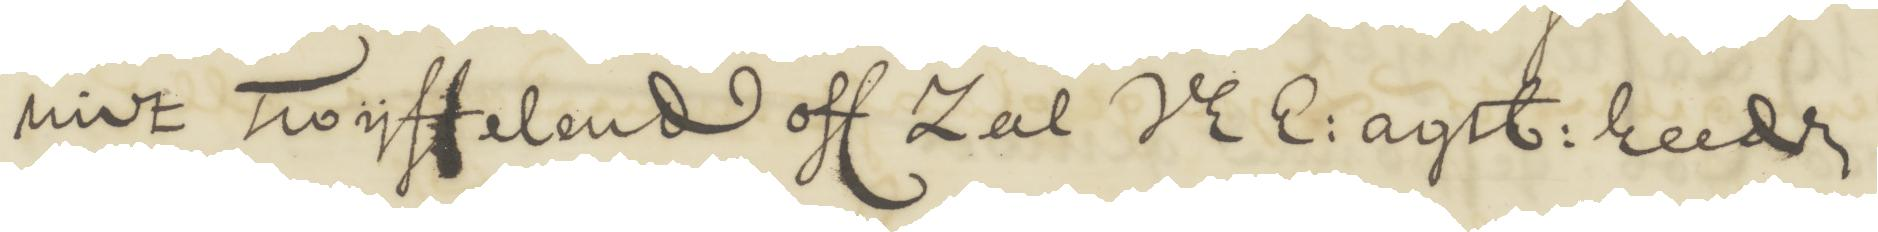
niet twijffelende off zal VE E: agtb: heeden
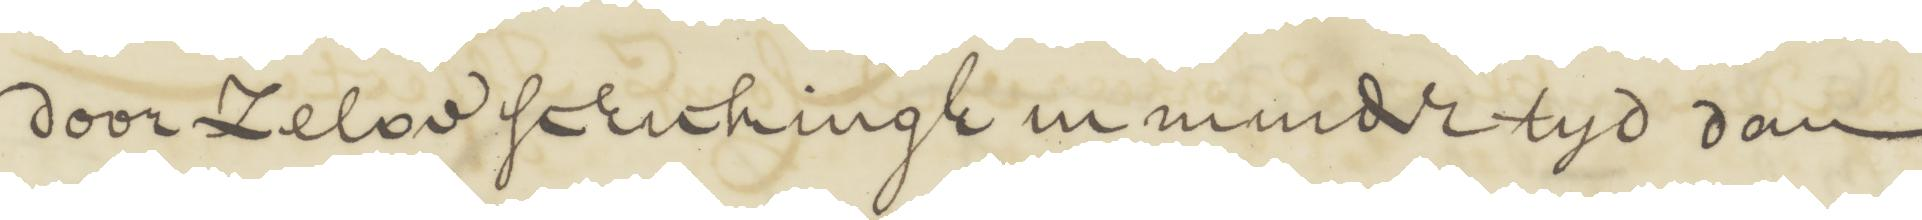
door zelve schickingh in minder tyd dan
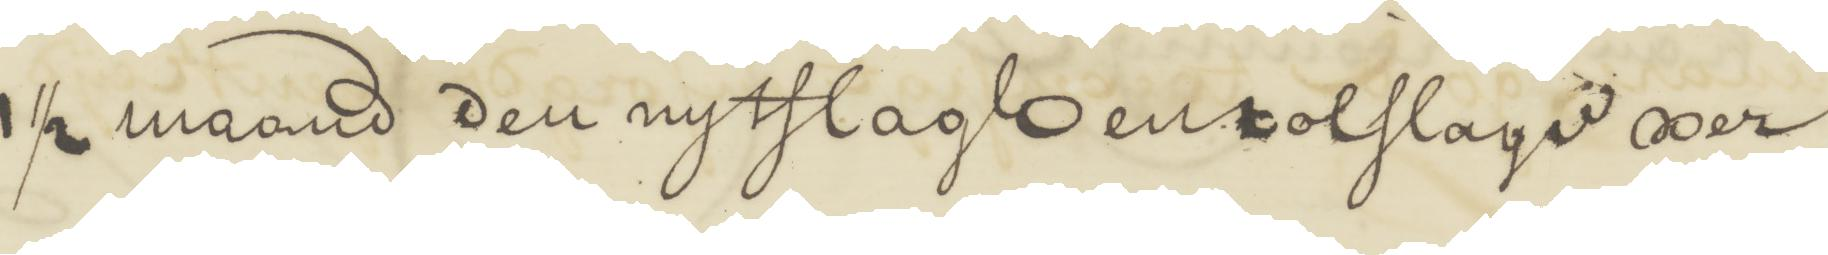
1½ maand den uytslagh en volslage ver
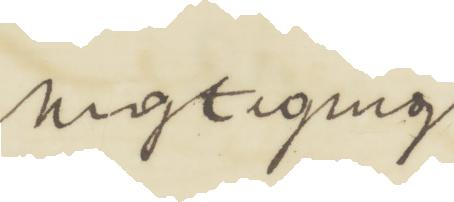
rigtiging
